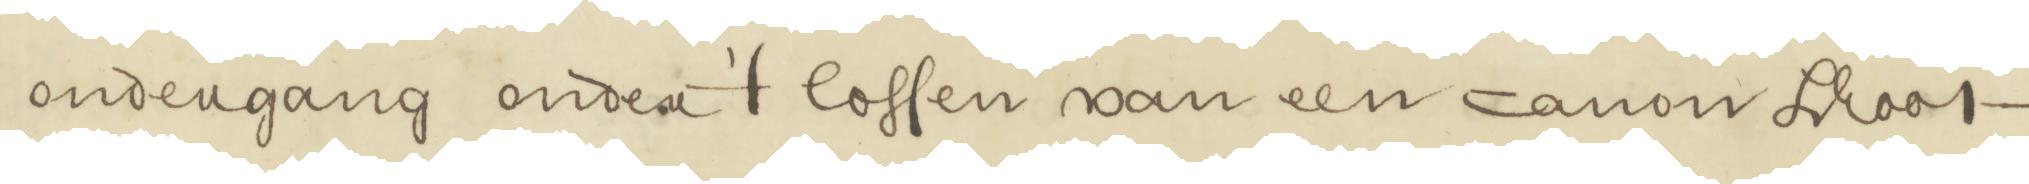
ondergang onder ’t lossen van een canon schoot
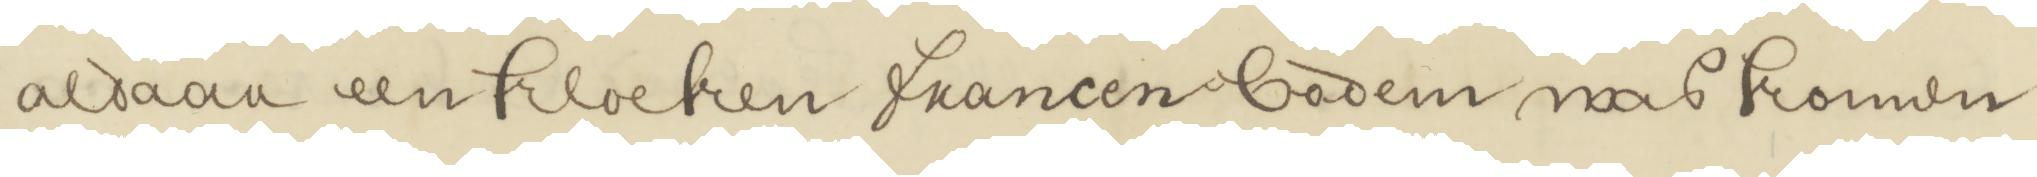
aldaar een kloeken francen bodem was komen
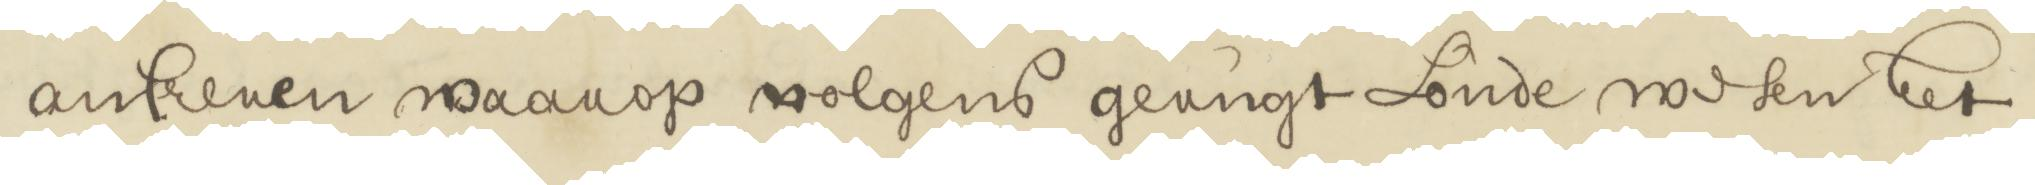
ankeren waarop volgens gerugt soude wesen het
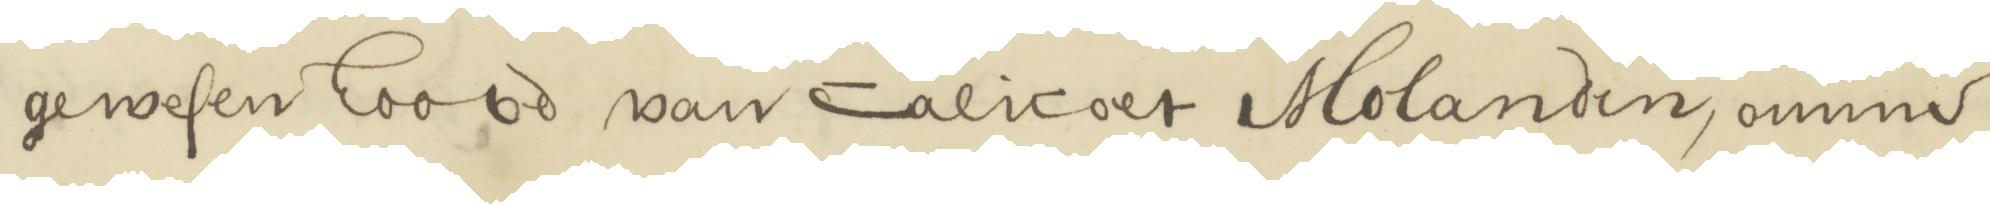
gewesen hoovd van calicoet Molandin, omme
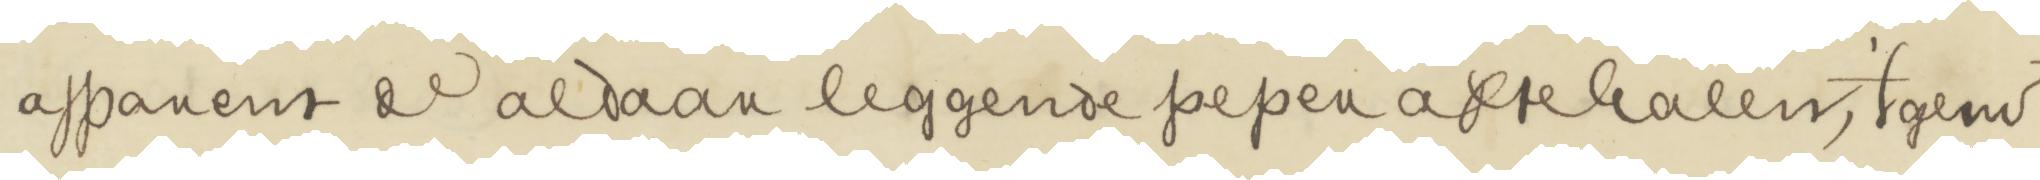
apparent de aldaar leggende peper aftehalen, 't gene
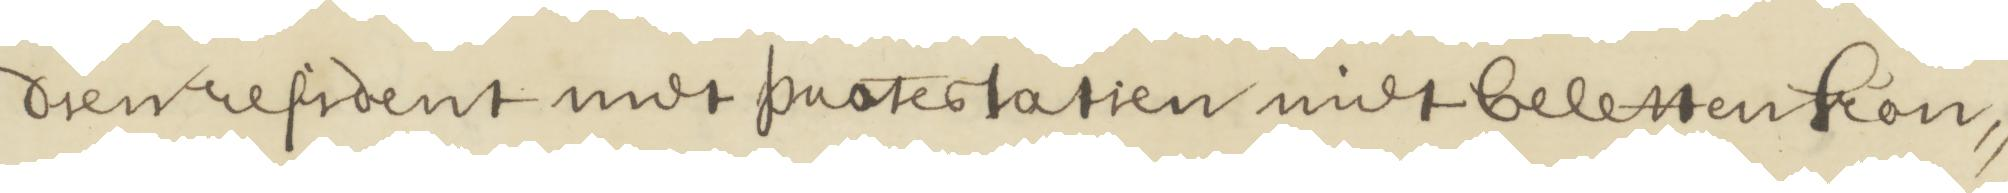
dien resident met protestatien niet beletten kon
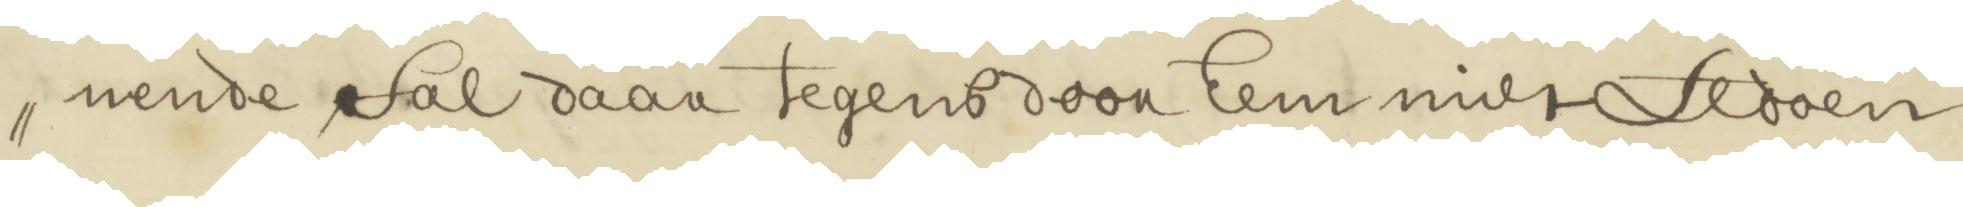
„nende sal daar tegens door hem niet te doen
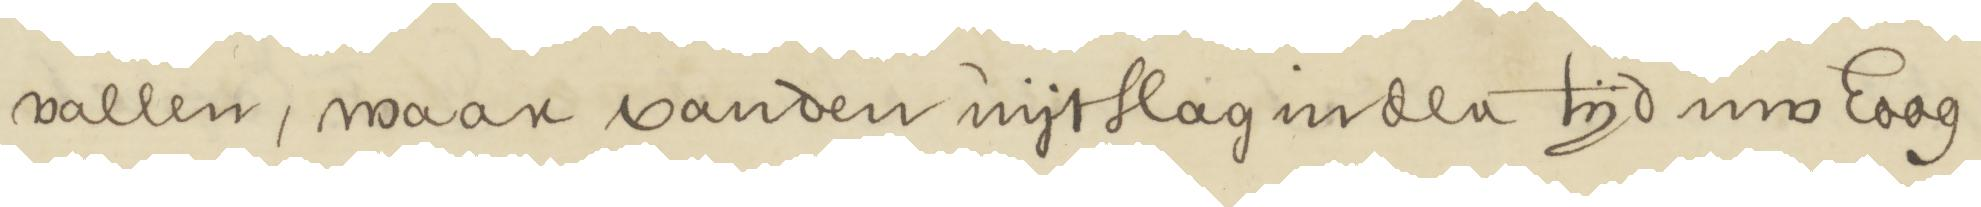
vallen, waar vanden uijtslag in der tijd uw hoog
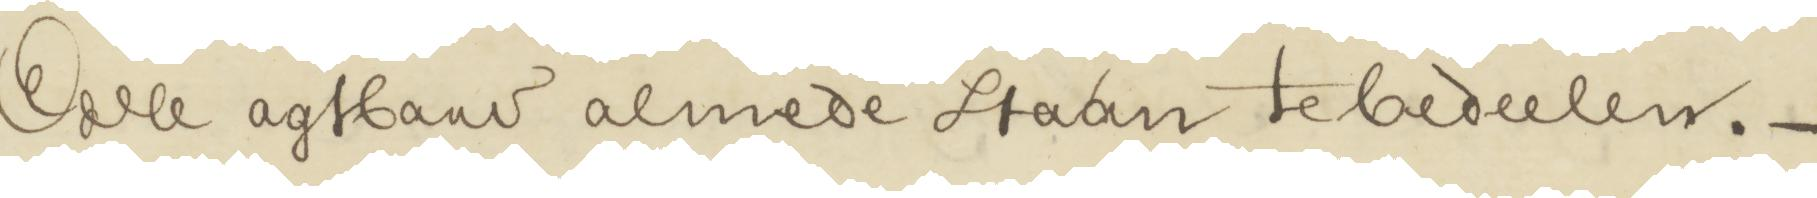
Edele agtbare almede staan te bedeelen. —
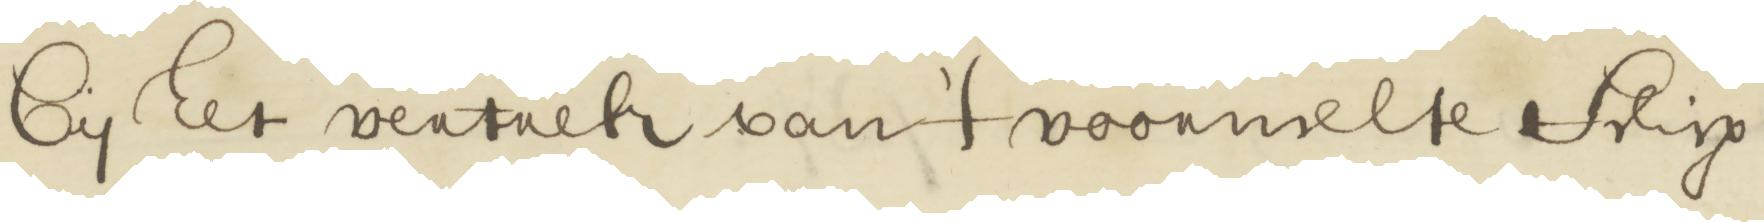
bij het vertrek van ’t voormelte schip
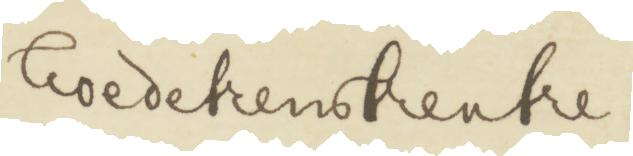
hoedekenskerke
